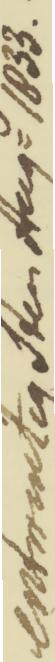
en twintigsten Aug=o 1833.
